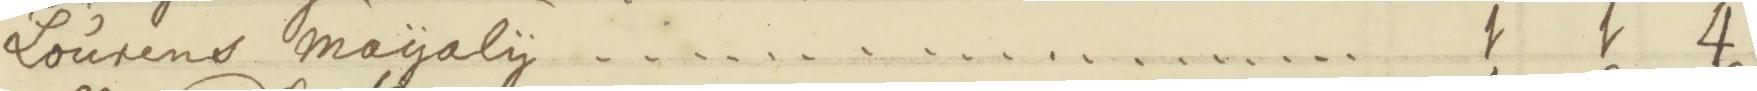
Lourens maijalij . . . . . . . . . . . . . . . . . . . . 1 1 4
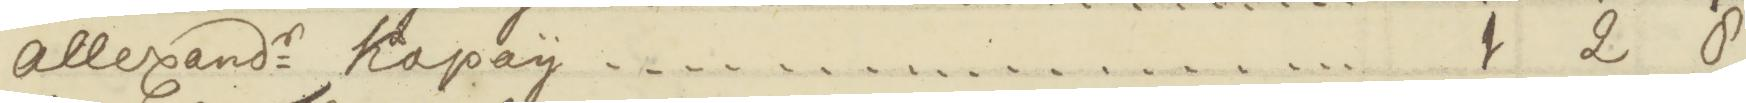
allexand=r Kapaij - - - - - - - - - - - - - - - - - - - 1 2 8
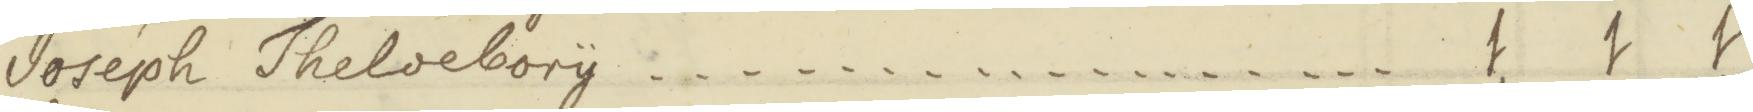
Ioseph Theloeborij .- - - - - - - - - - - - - - - - - - 1 1 1
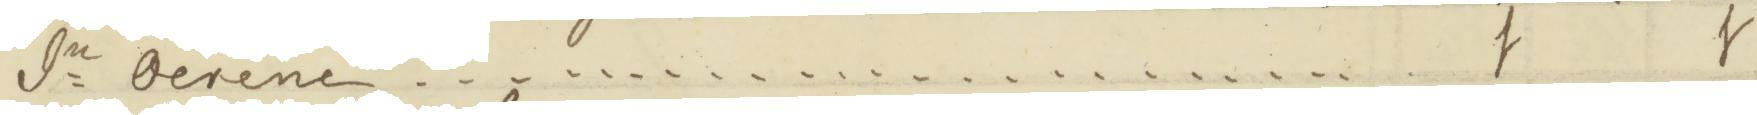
I=n Oerene - - - - - - - - - - - - - - - - - - - - - - - - 1 1
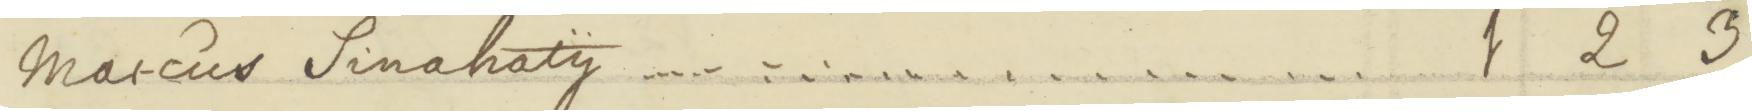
Marcus Sinahatij - - - - - - - - - - - - . . . . - - - . 1 2 3
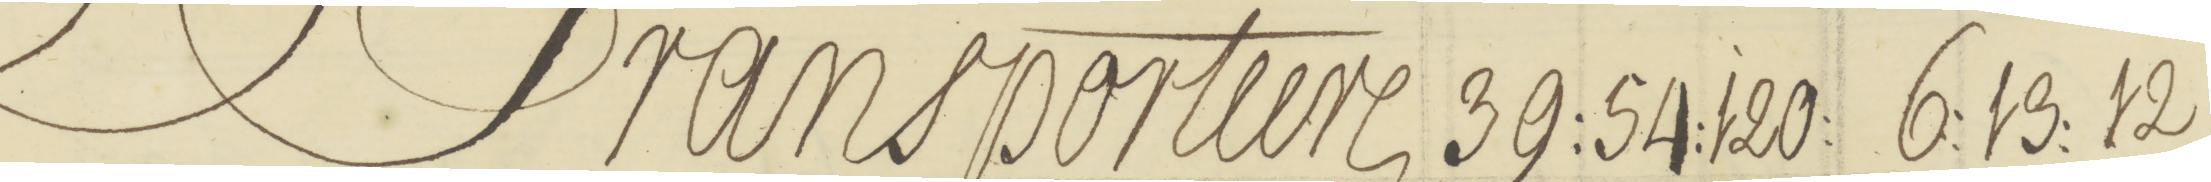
Transporteere 39:54:120: 6:13:12
